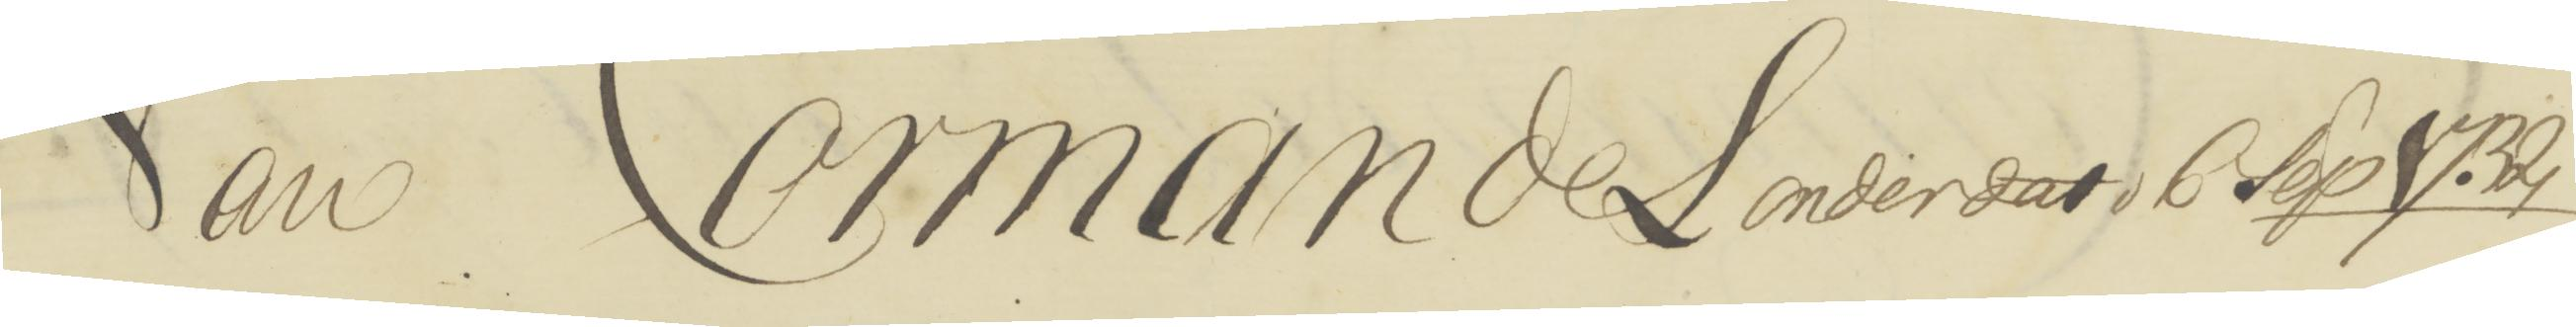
Van Cormandel onderdato 6 Sep 1732
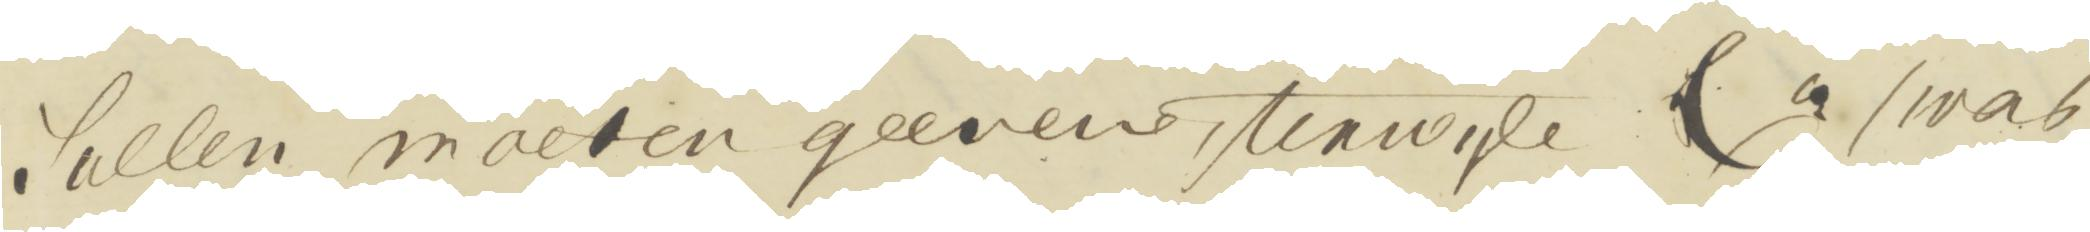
sullen moeten geeven, terwyle Et-a /was
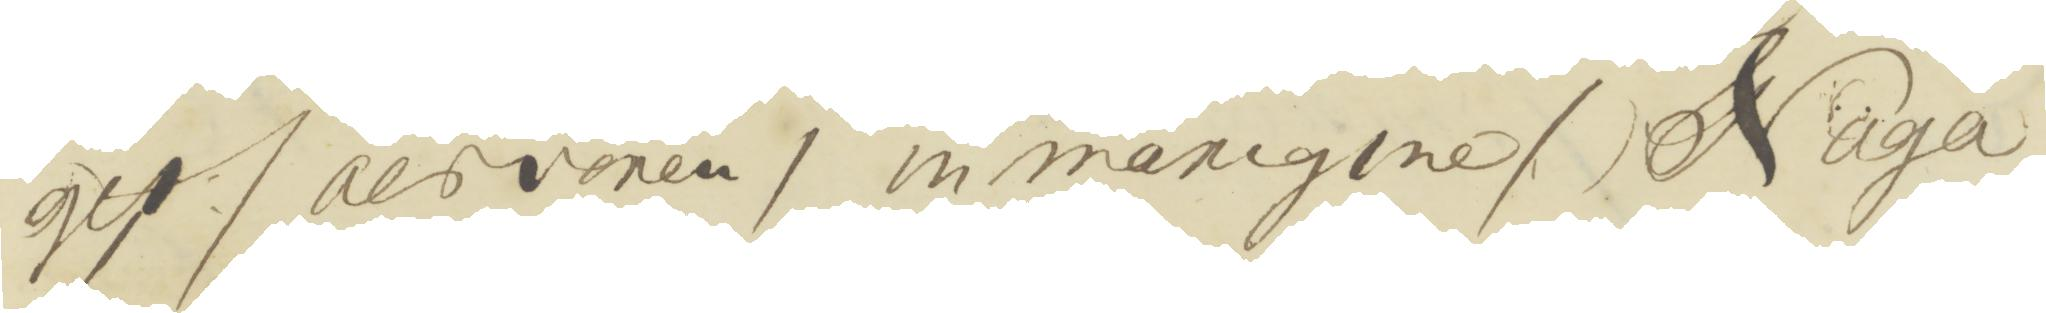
get:/ als voren / in margine/ Naga
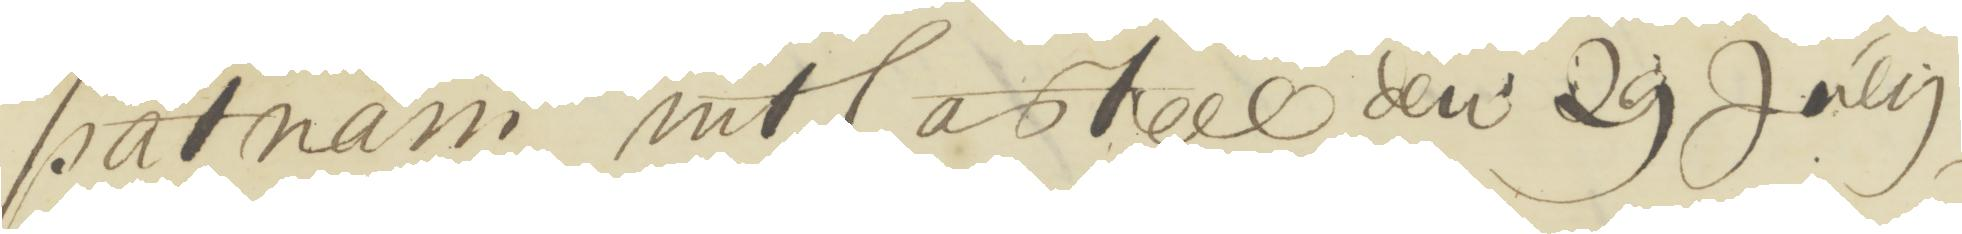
patnam int Casteel den 29 Julij
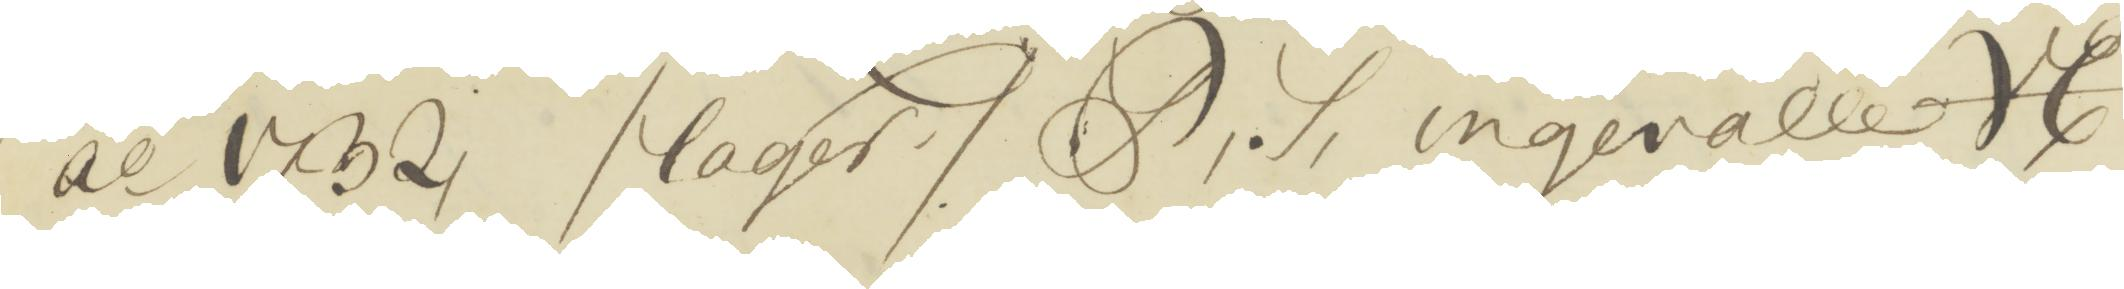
a_o 1732; /lager:/ P, S, ingevalle VE
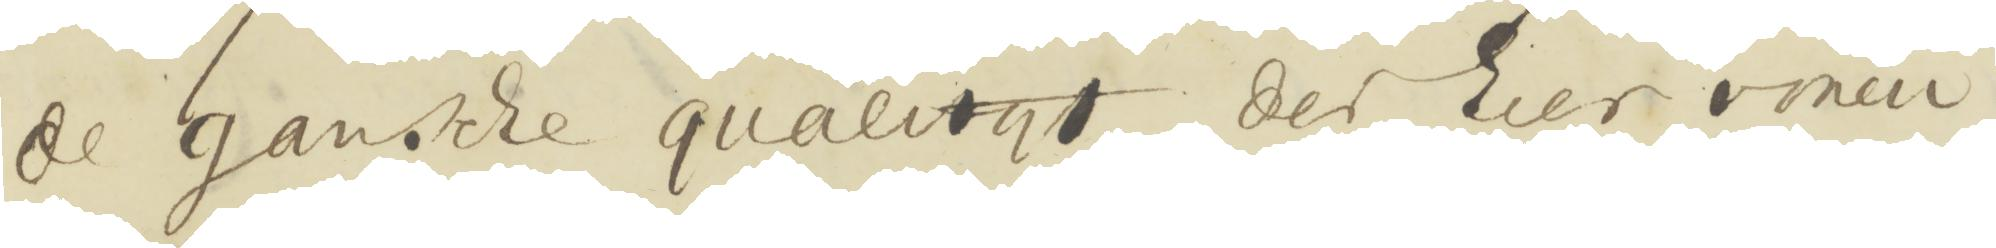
de gansche qualityt der hier voren
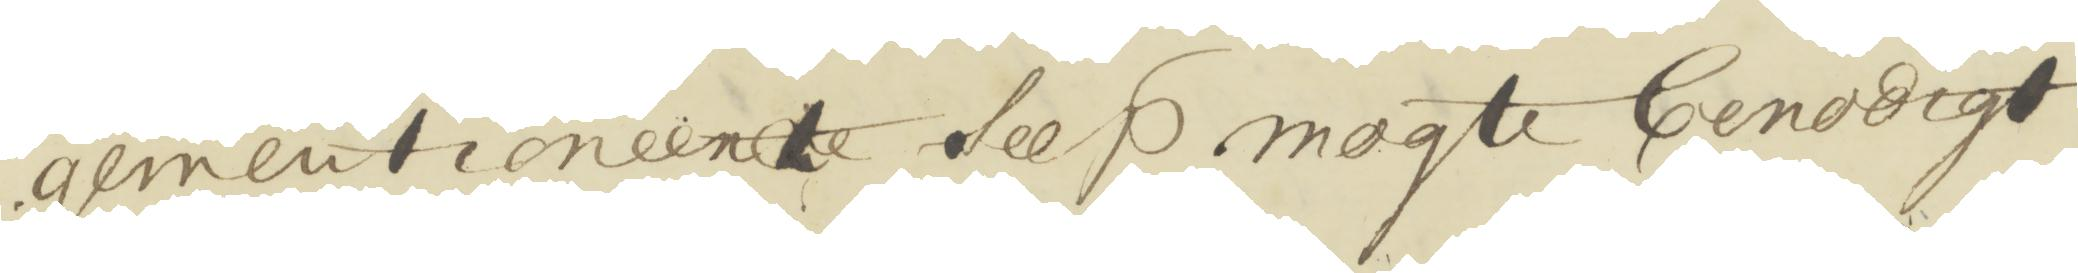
gementioneerde seep mogte benodigt
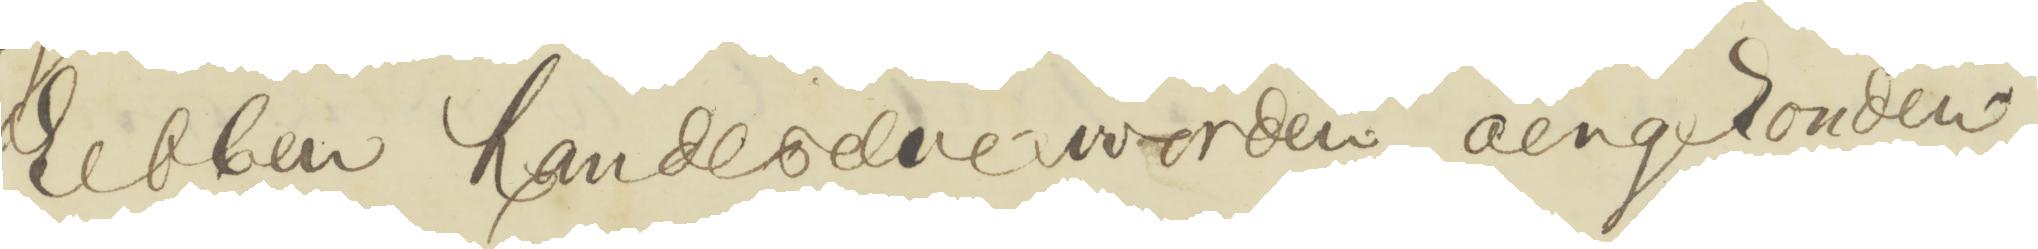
hebben kan deselve worden aengesonden
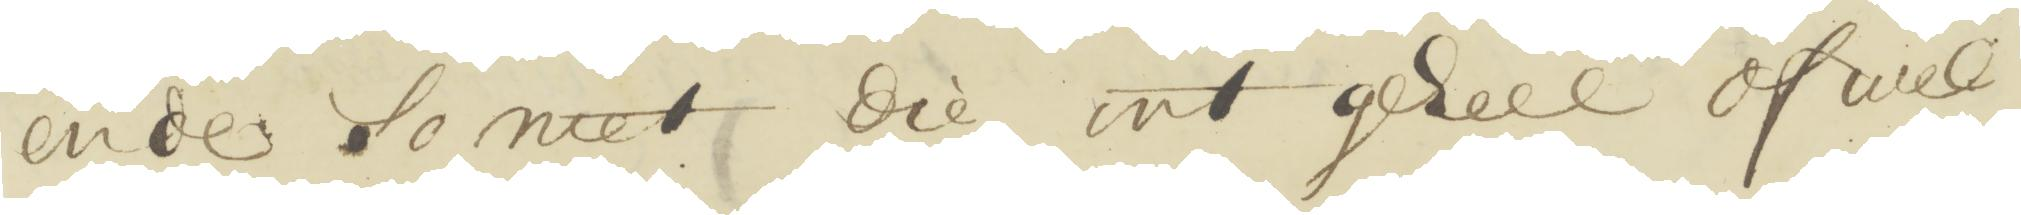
ende so niet die int geheel of wel
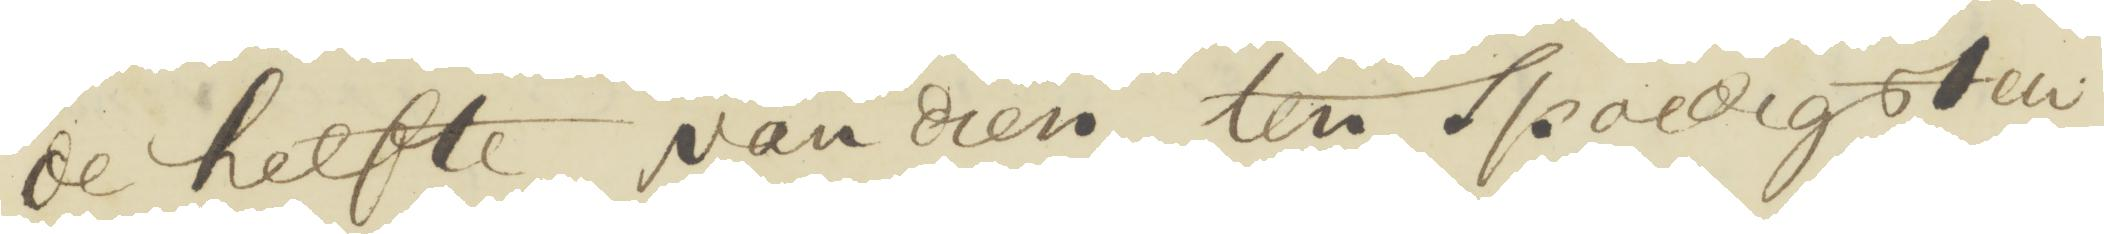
de helfte van dien tenspoedigsten
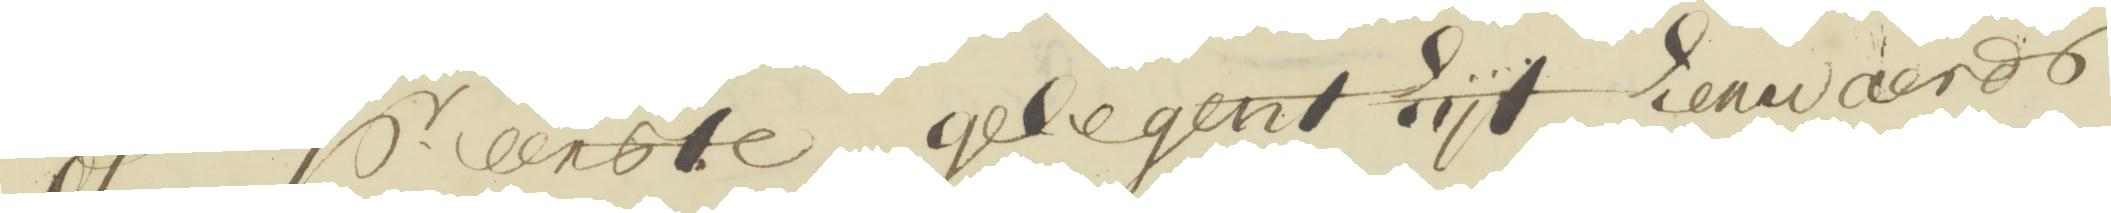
of p:r eerste gelegenthijt herwaerds
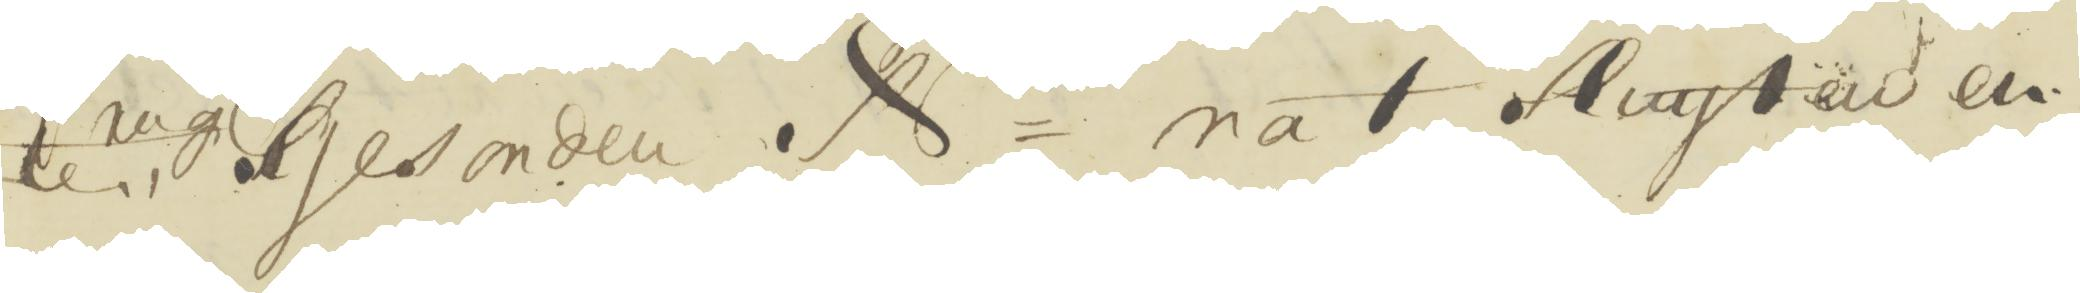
te„rug gesonden Et=a na t sluyten en
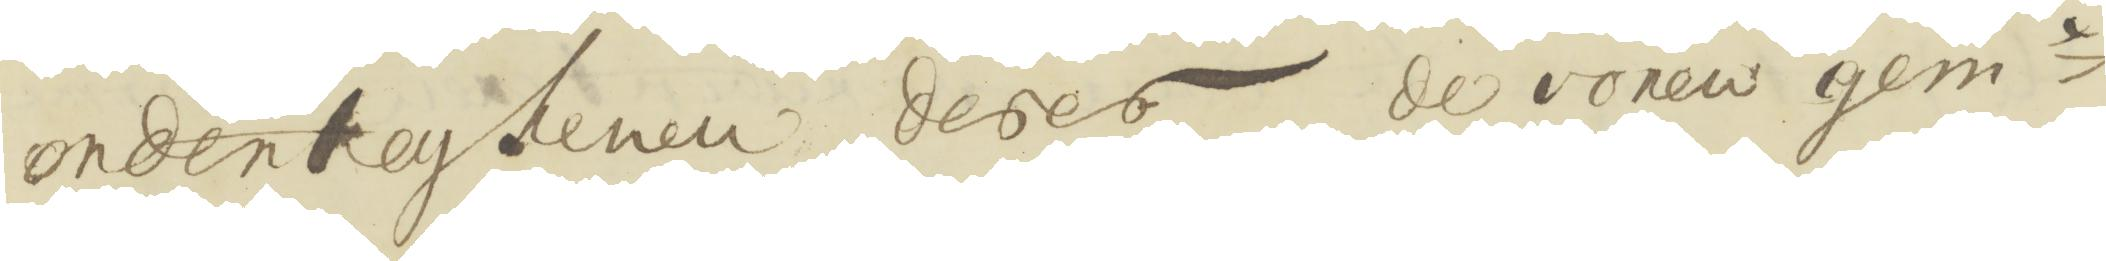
onderteykenen deses de voren gem=e
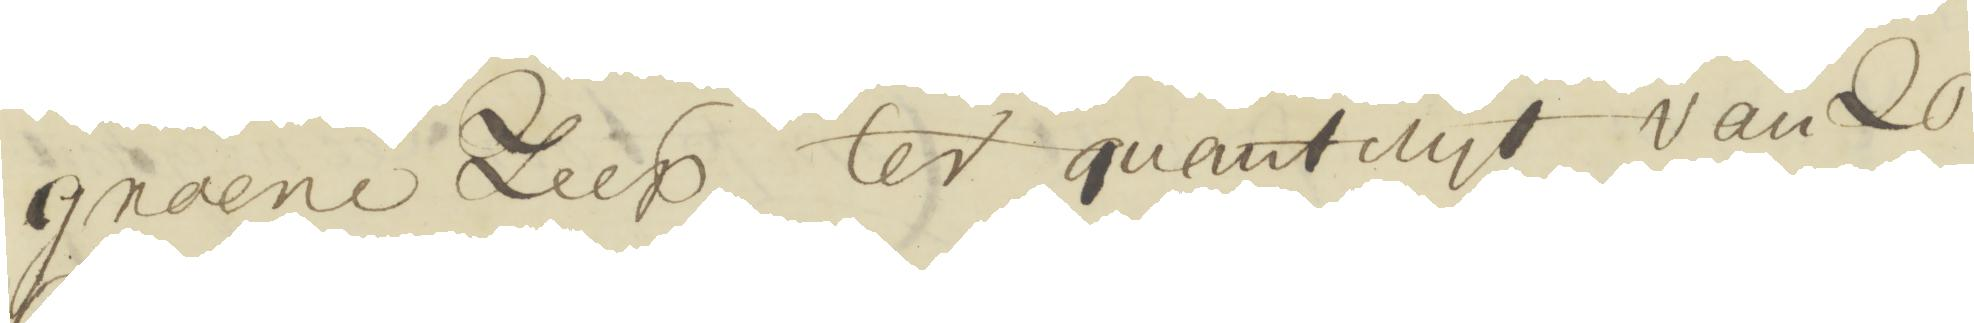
groene Zeep ter quantityt van 20
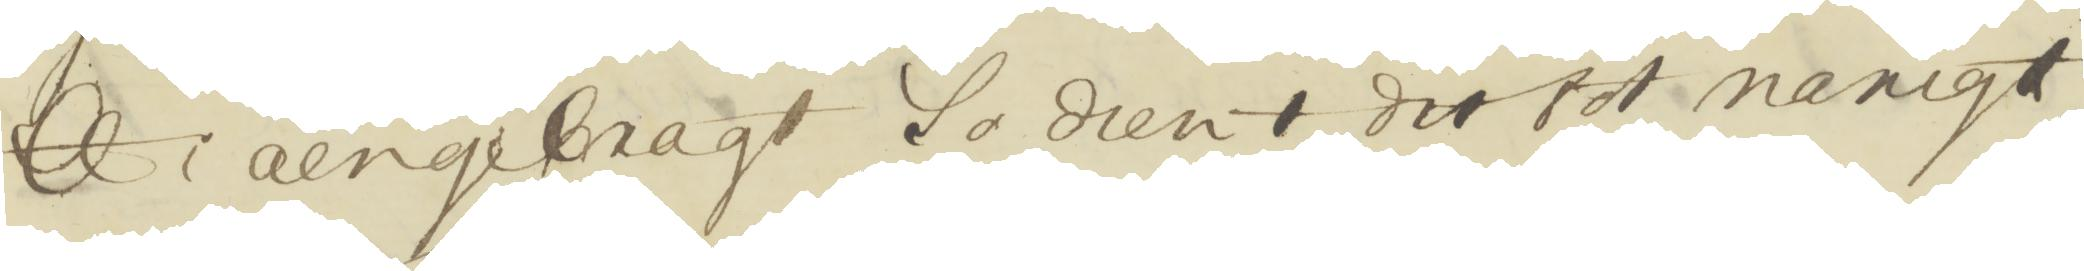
lb; aengebragt so dient dittot narigt
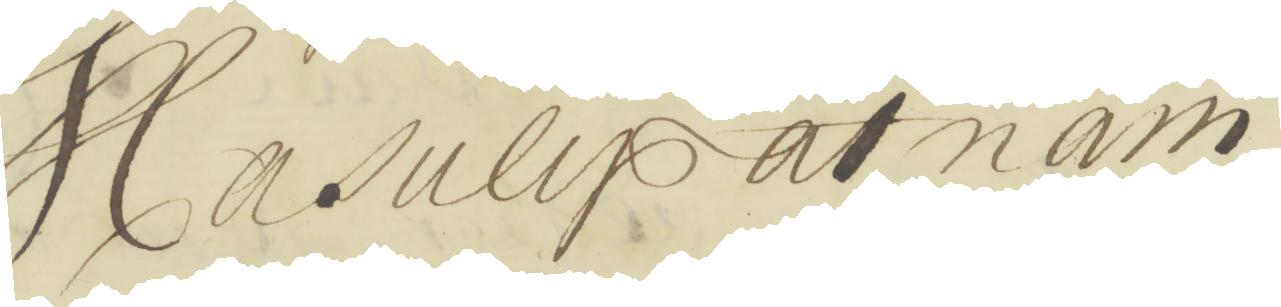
Masulipatnam
